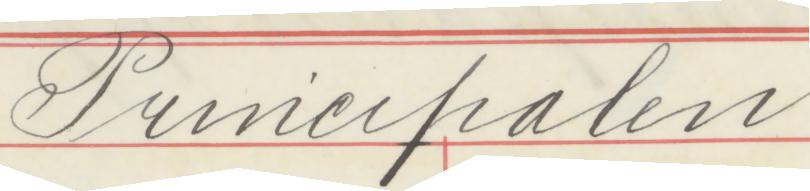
Principalen
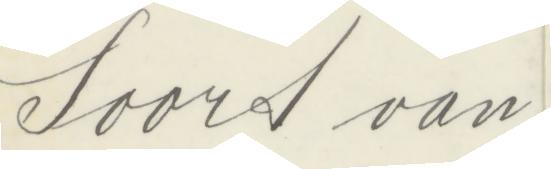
Soort van
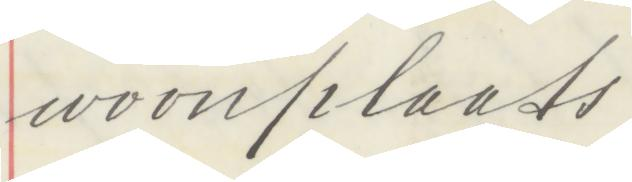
woonplaats
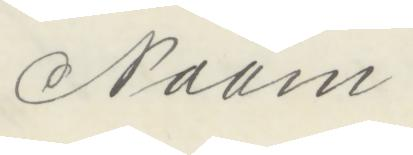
Naam
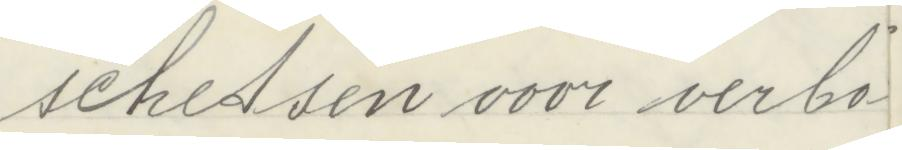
schetsen voor verbo-
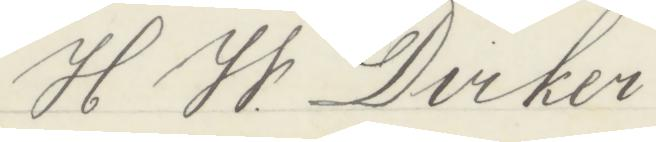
H W. Dirker
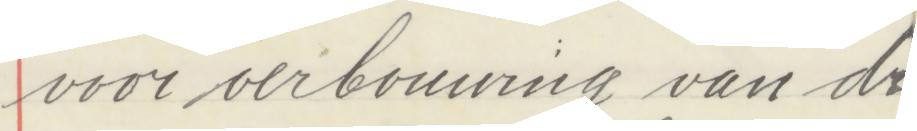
voor verbouwing van de
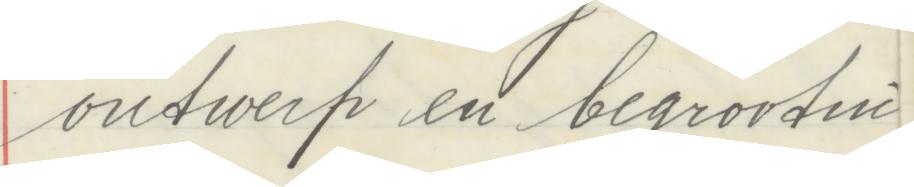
ontwerp en begrootin
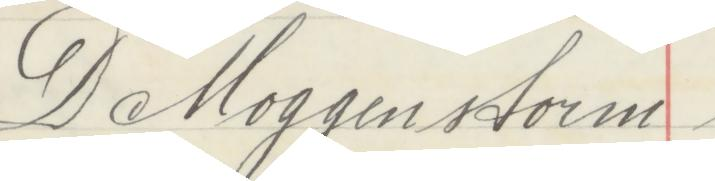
D Moggenstorm
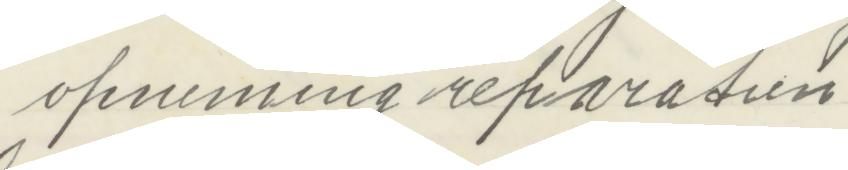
opneming reparatien
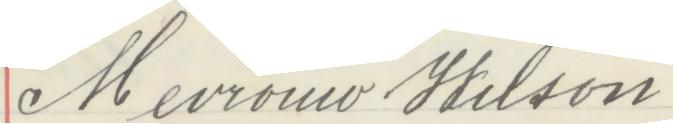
Mevrouw Wilson
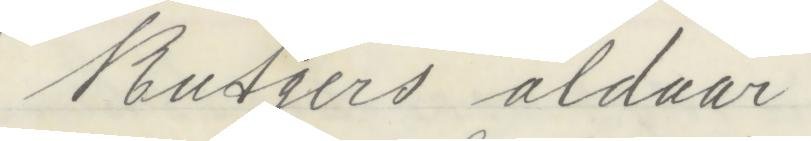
Rutgers aldaar
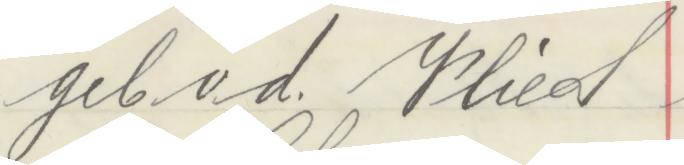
geb. v.d. Vliet
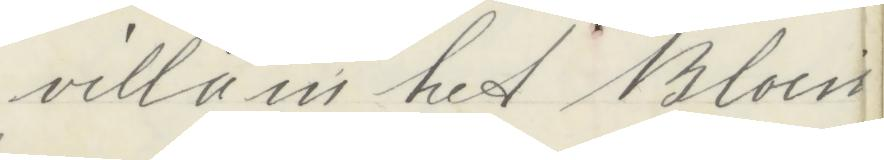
villa in het Bloen
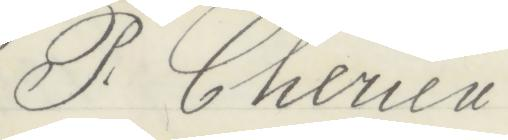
P Cherieu
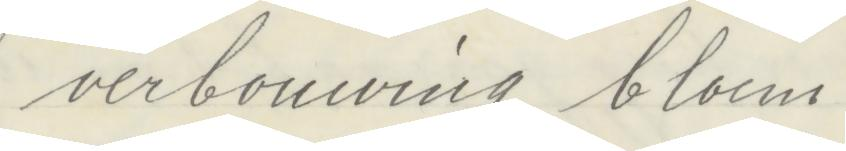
verbouwing bloem
